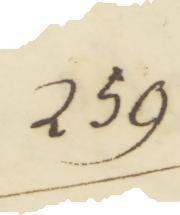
259
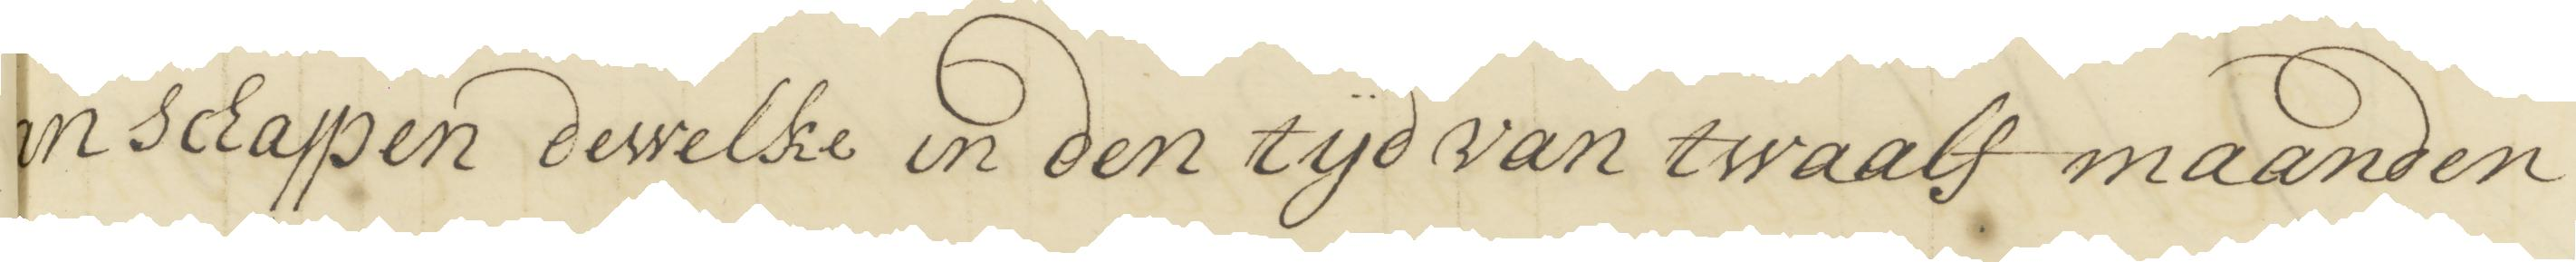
n schappen dewelke in den tijd van twaalf maanden
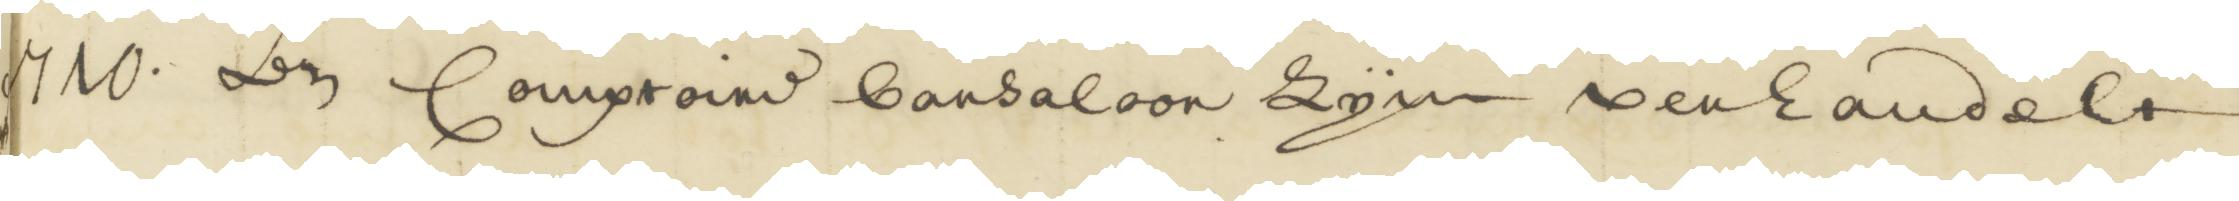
710. ten Comptoire barsaloor zijn verhandelt
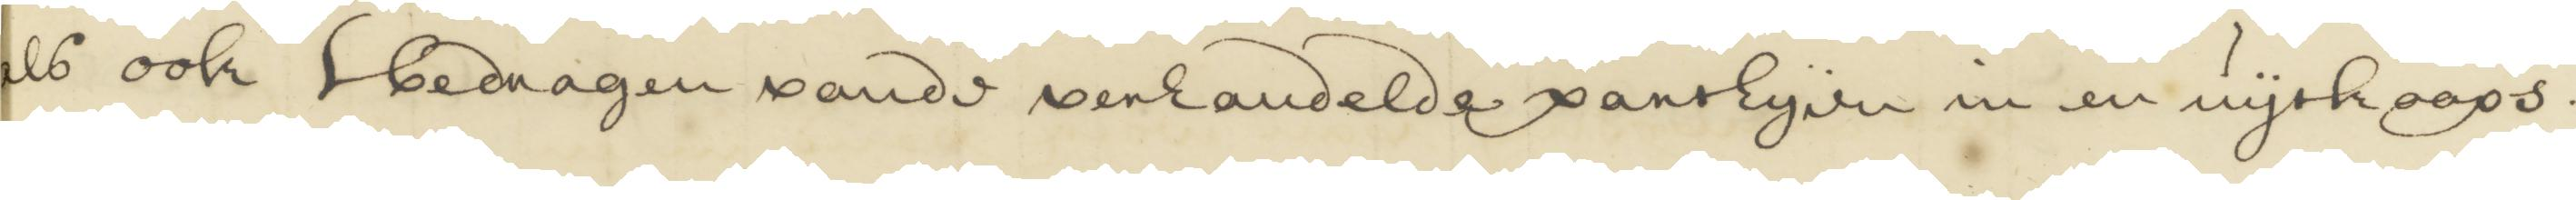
ls ook ’t bedragen vande verhandelde parthijen in en uijtkoops
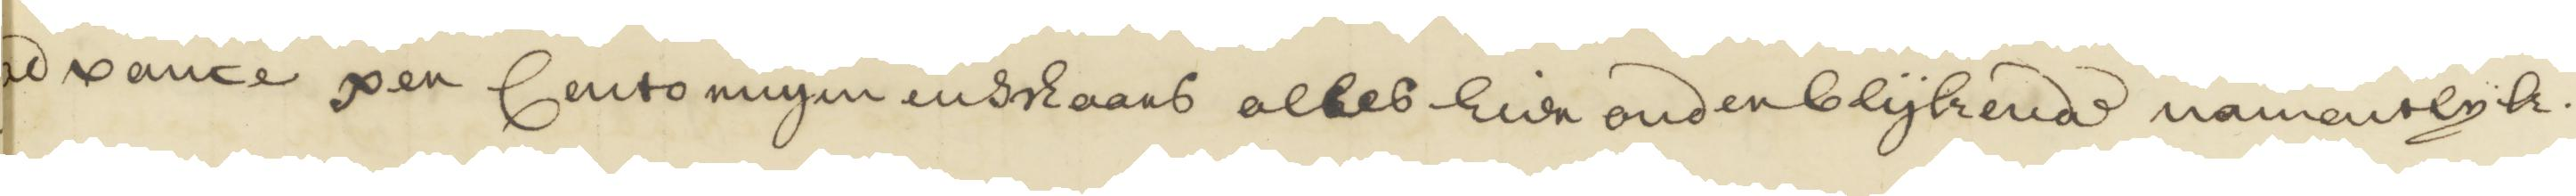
dvance per Cento ruijm enschaars alles hier onderblijkende namentlijk.
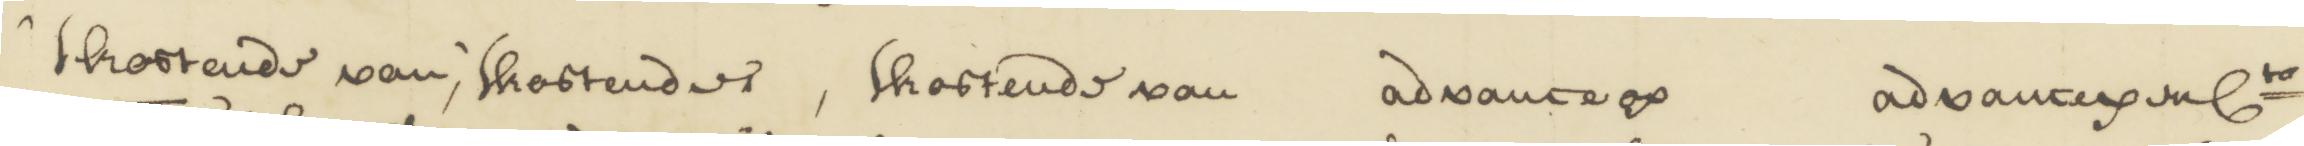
'tkostende van, 'tkostende„ , tkostende van advance op advance perC=to
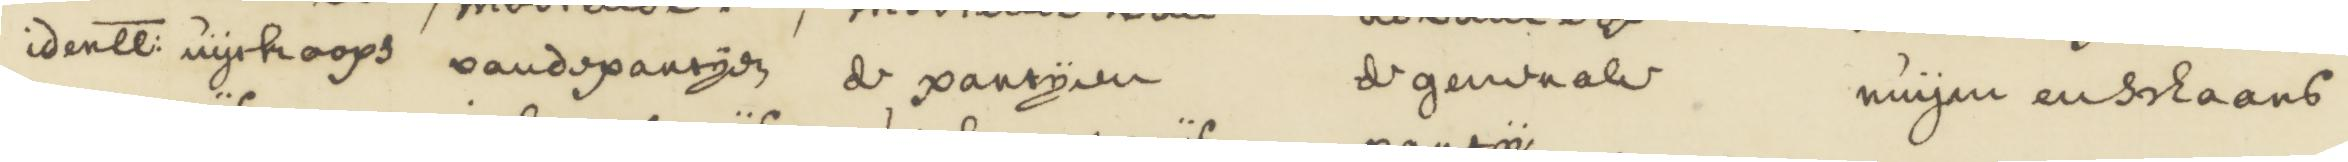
iderlb: uijtkoops van de partijen de partijen de generale ruijm en schaars
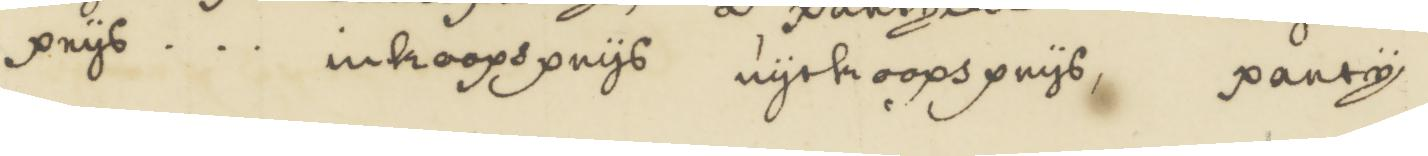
prijs . . . inkoops prijs uijtkoops prijs, partij
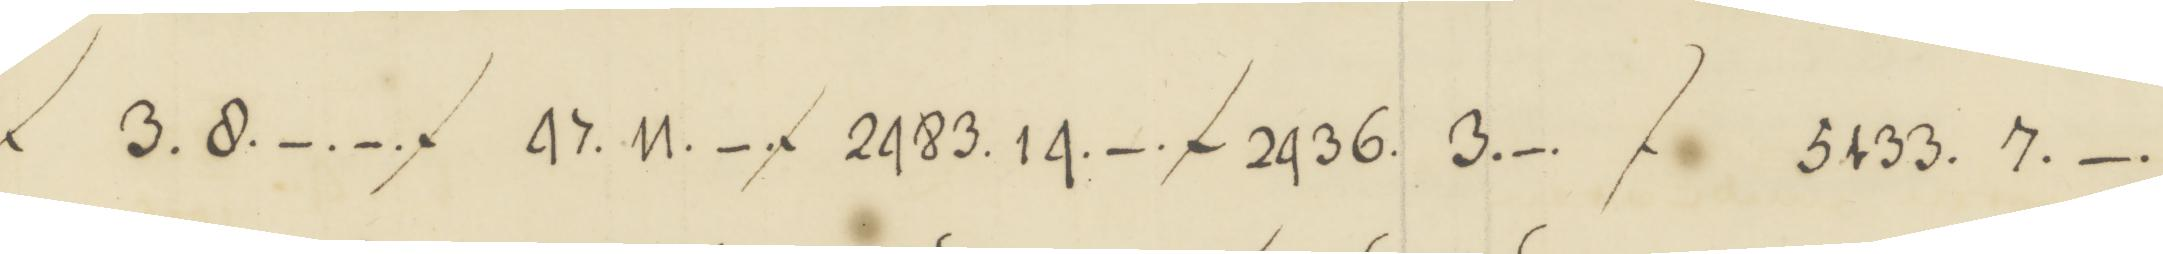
ƒ 3.8. – . – . ƒ 47. 11. – .ƒ 2483. 14. – . ƒ 2436. 3.–. ƒ 5133. 7. —.
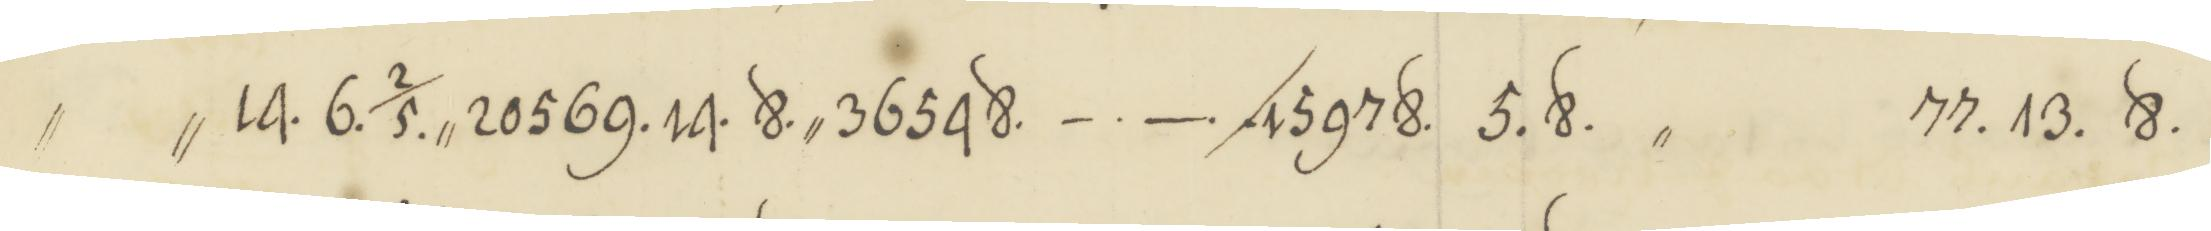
„ „ 14. 6.2/5. „ 20569.14.8. „ 36548. – . —. ƒ15978. 5. 8. „ 77. 13. 8.
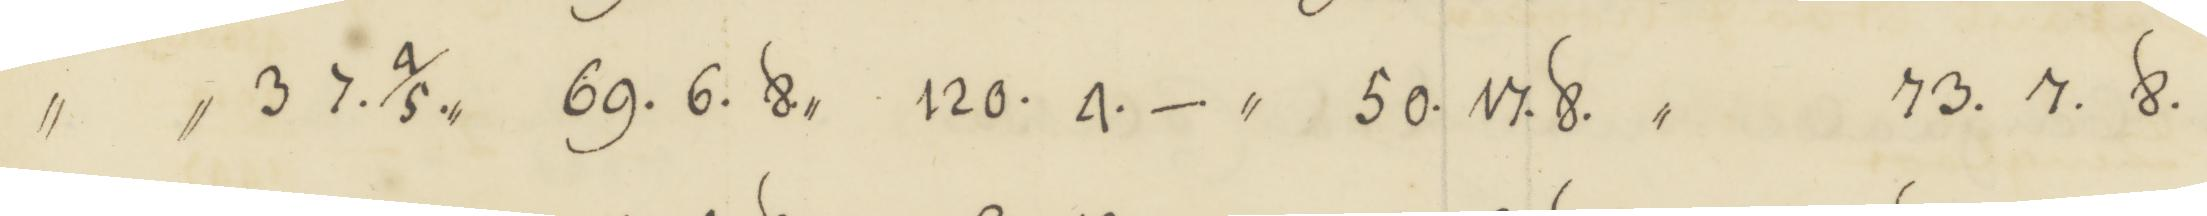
„ „ 3 7.4/5.„ 69. 6. 8.„ 120. 4. –. „ 50. 17. 8. „ 73. 7. 8.
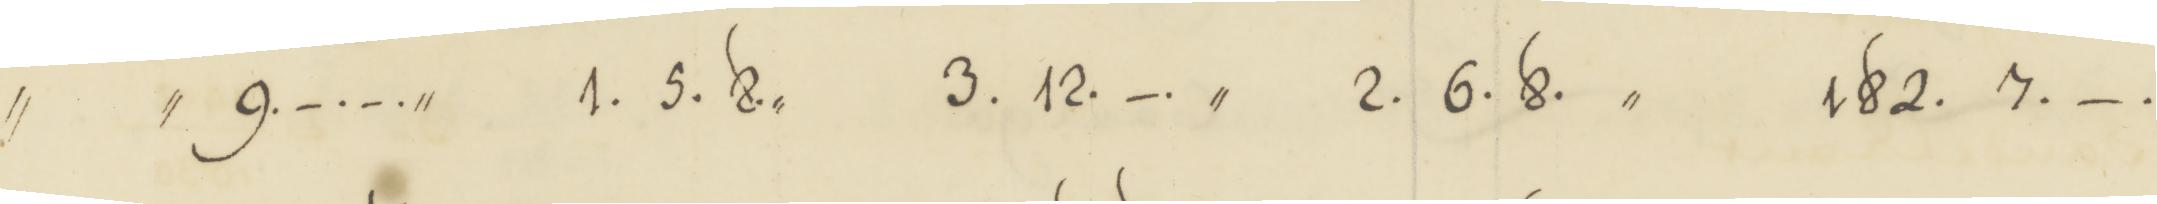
„ „ 9. – . – . „ 1. 5. 8.„ 3. 12. – . „ 2. 6. 8. „ 182. 7. —
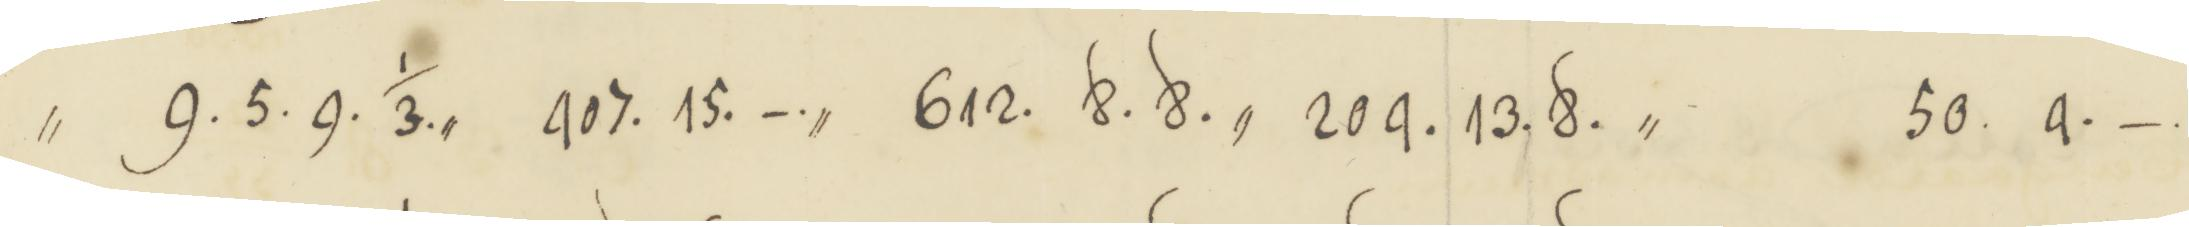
„ 9. 5. 9. 1/3. „ 407. 15. – . „ 612. 8. 8. „ 204. 13. 8. „ 50. 4. —
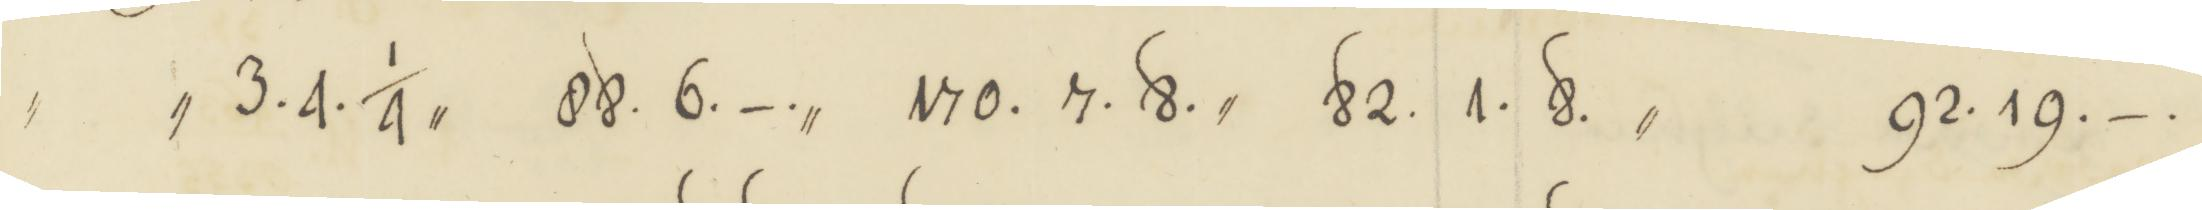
„ „ 3. 4. ¼ „ 88. 6. – . „ 170. 7. 8. „ 82. 1. 8. „ 92. 19. – .
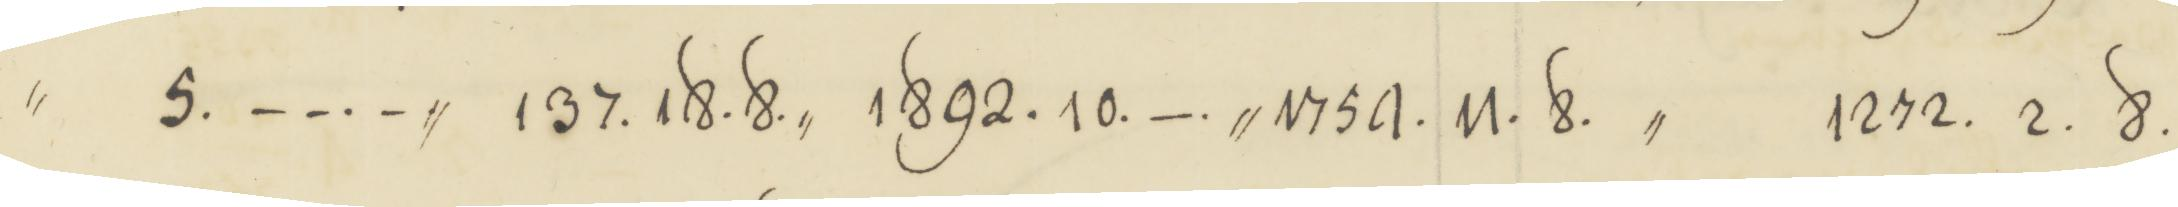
„ 5. – – . – „ 137. 18. 8. „ 1892. 10. – . „ 1754. 11. 8. „ 1272. 2. 8
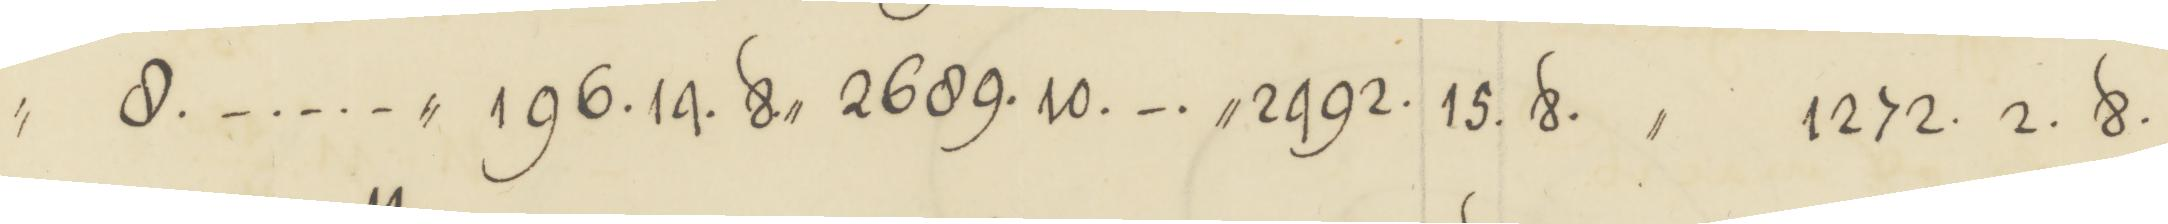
„ 8. – . – . – „ 196. 14. 8.„ 2689. 10. – . „ 2492. 15. 8. „ 1272. 2. 8.
